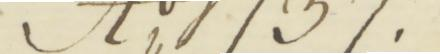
A„o 1737.
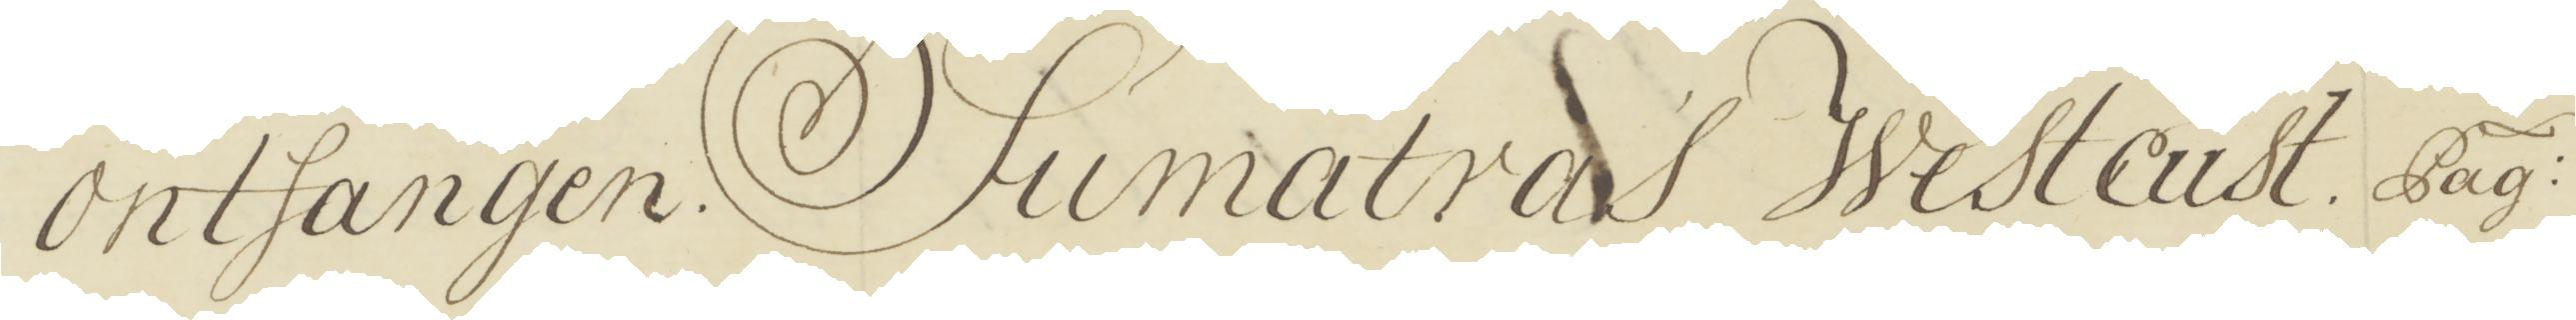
ontfangen. Sumatra's west cust. Pag:
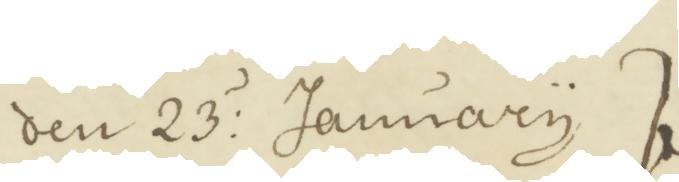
den 23:' Januarij
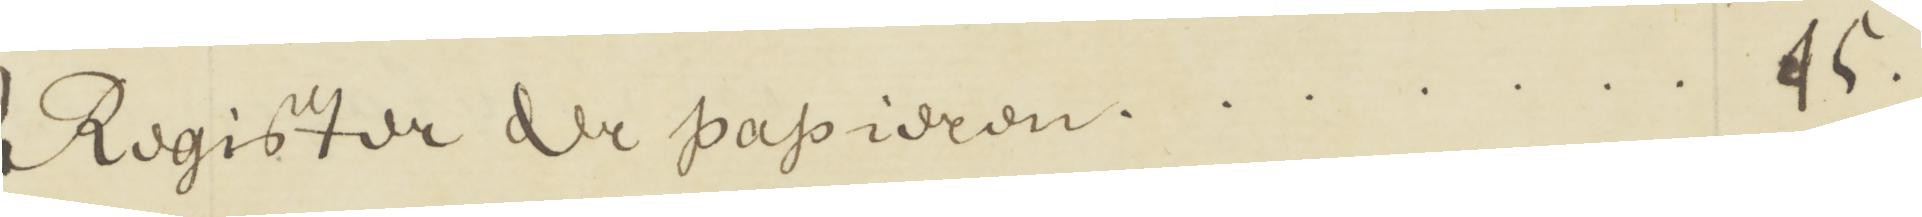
Register der papieren. . . . . . .45.
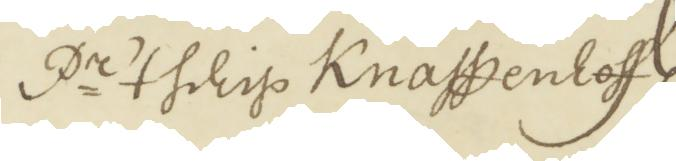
P=r ’t schip Knappenhoff
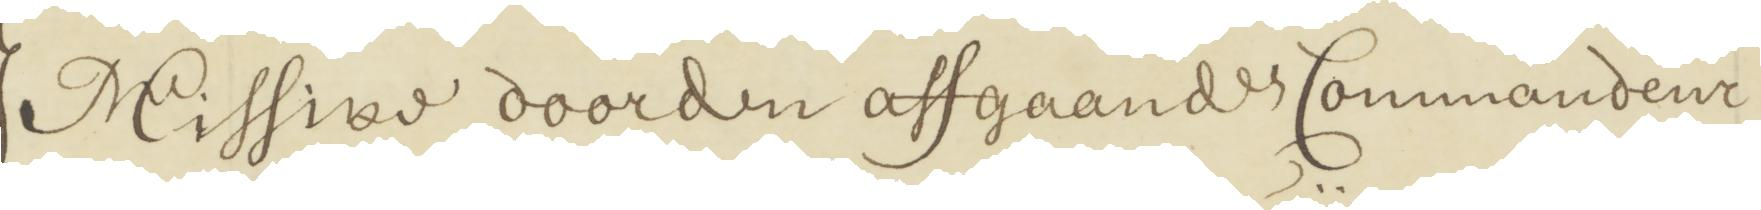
Missive door den affgaande Commandeur
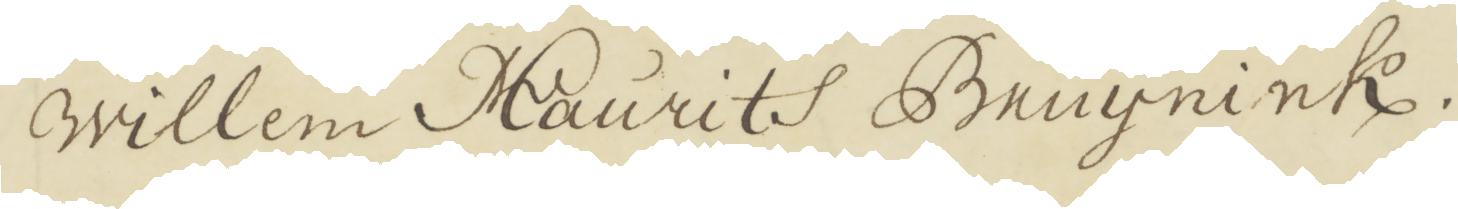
willem Maurits Bruijnink.
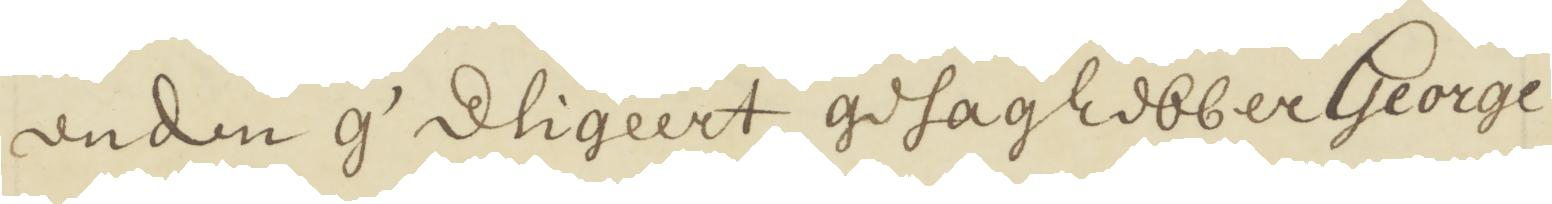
en den g’ Eligeert gesaghebber George
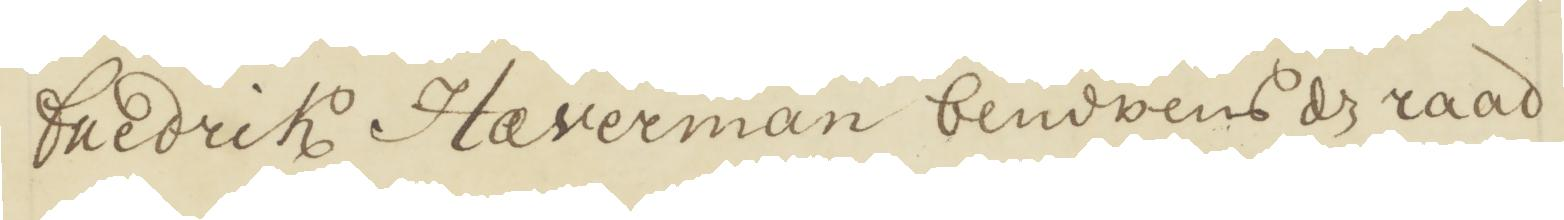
fredrik Haverman benevens den raad
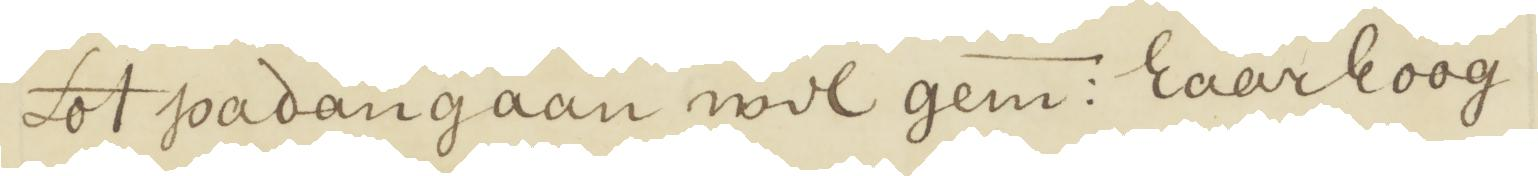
tot padang aan wel gem: haar hoog
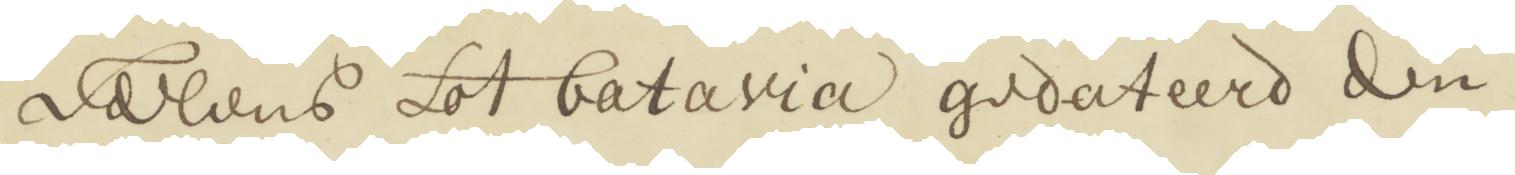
Edelens tot batavia gedateerd den
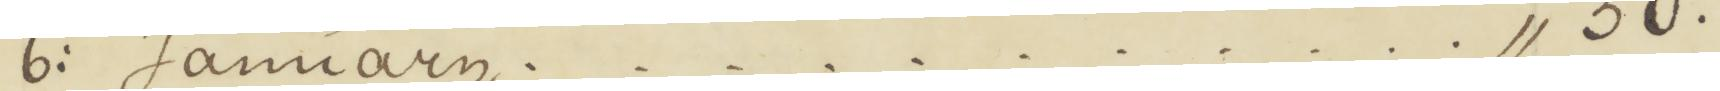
6:' Januarij.. . . . . . . . . „ 50.
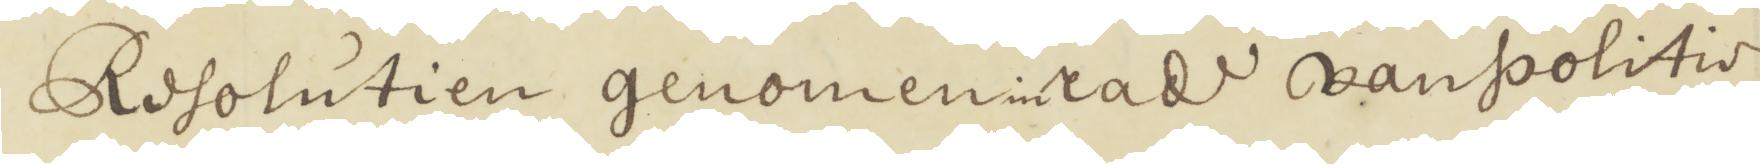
Resolutien genomen in rade van politie
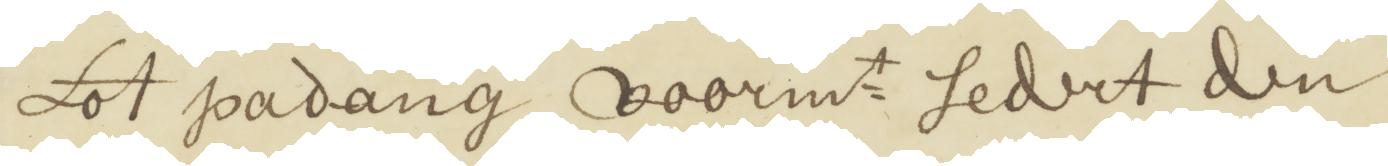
Tot padang voorm:te sedert den
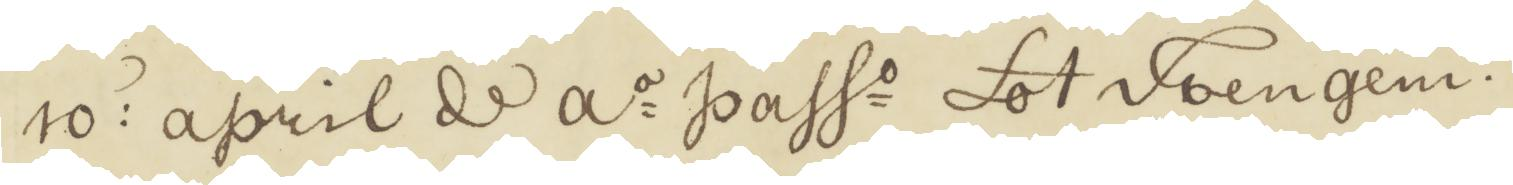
10:' april de a=o pass=o Tot Even gem:
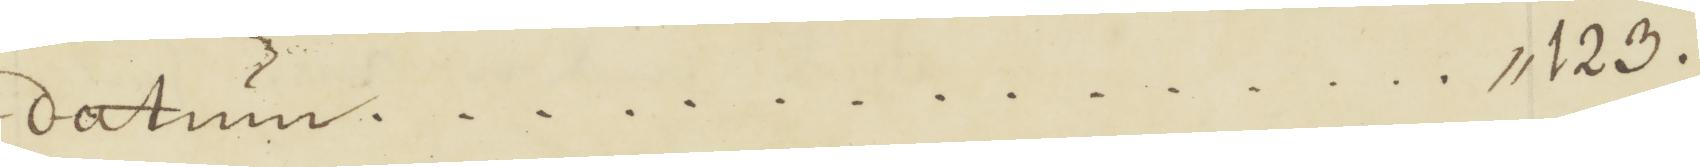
datum. . . . . . . . . . .„123.
